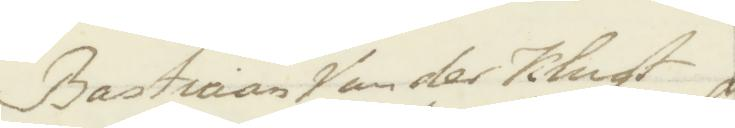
Bastiaan Van der Klugt
